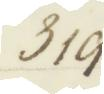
319
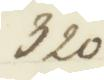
320
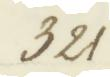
321
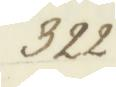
322
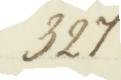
327
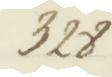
328
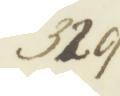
329
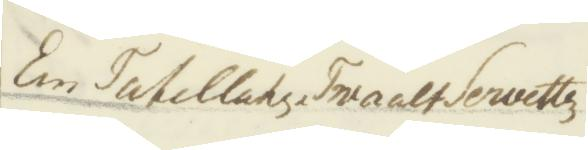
Een Tafellaken & Twaalf servetten
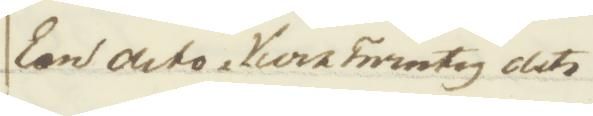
Een dito & Vier & Twintig dito
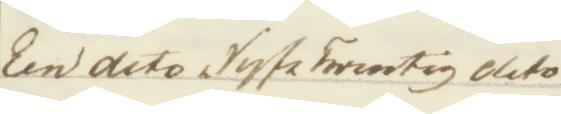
Een dito & Vyf & Twintig dito
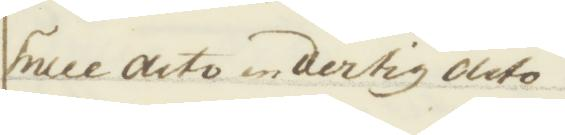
Twee dito en dertig dito
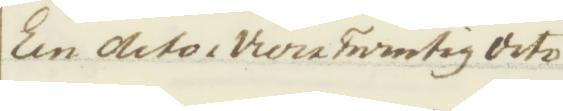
Een dito & vieren twintig dito
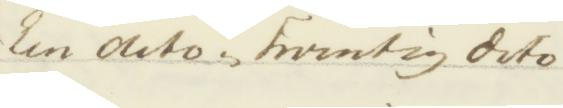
Een dito en Twintig dito
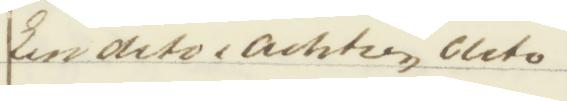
Een dito & achtien dito
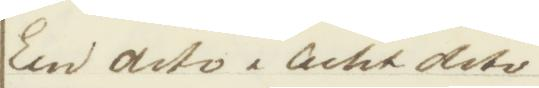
Een dito & acht dito
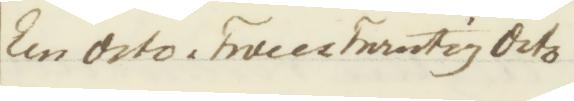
Een dito & Twee & twintig dito
